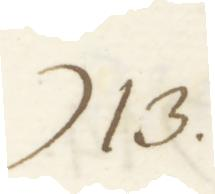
713.
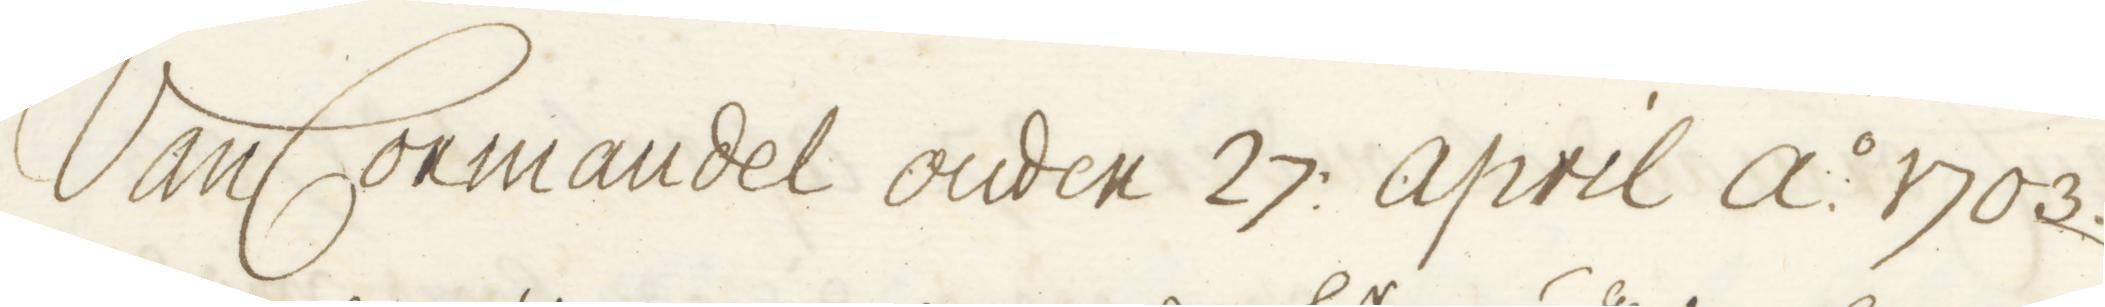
Van Cormandel onder 27: april a:o 1703
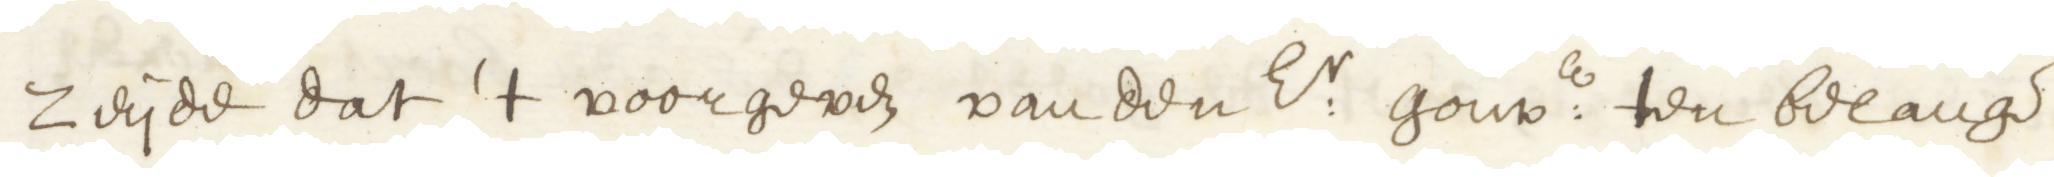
zeijde dat ’t voorgeven van den h:r gouv:r ten belange
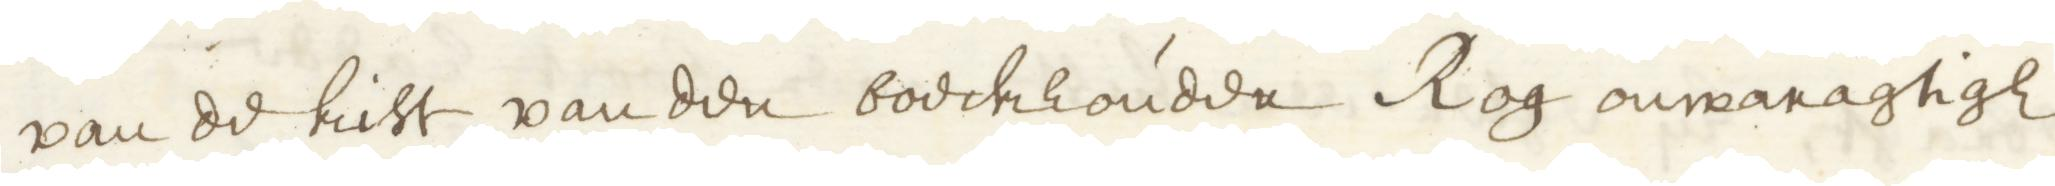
van de kist van den boeckhouder Rog onwaragtigh
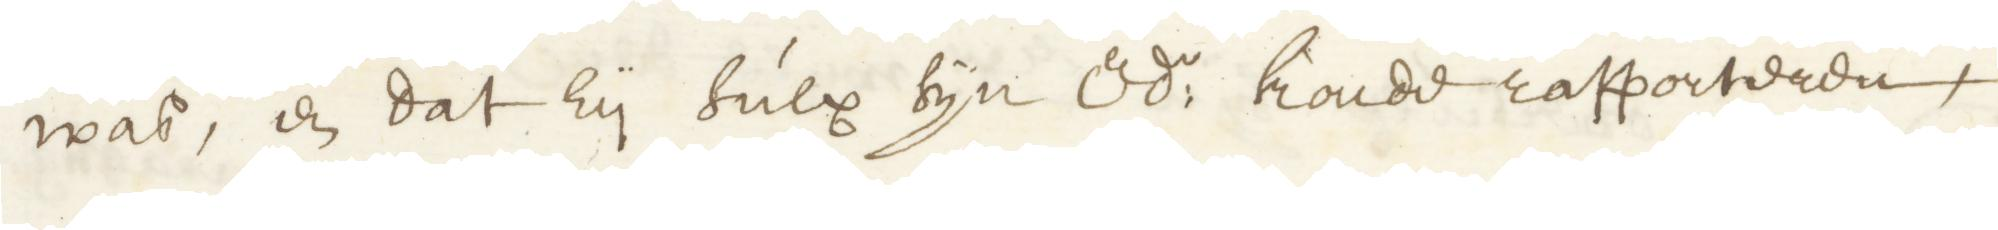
was, en dat hij sulx sijn Ed:s konde rapporteren,
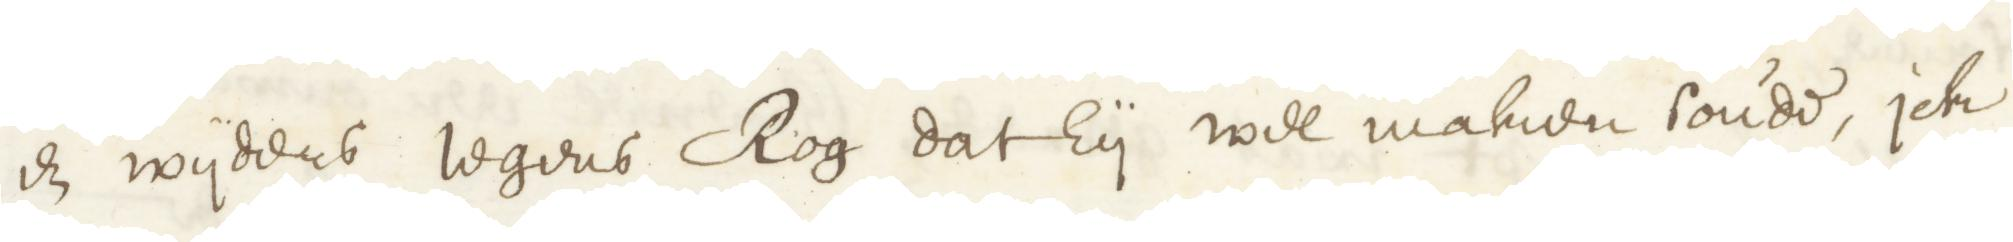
en wijders tegens Rog dat hij wel maken soude, jck
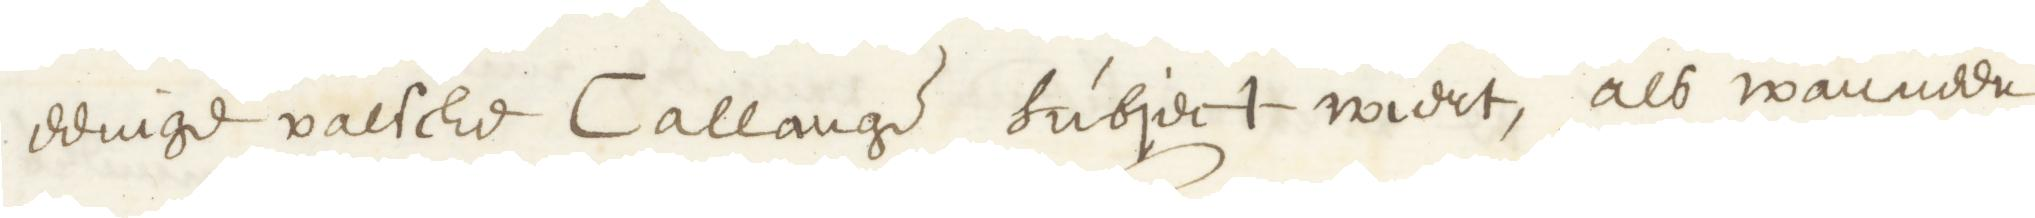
eenige valsche Callange subject wiert, als wanneer
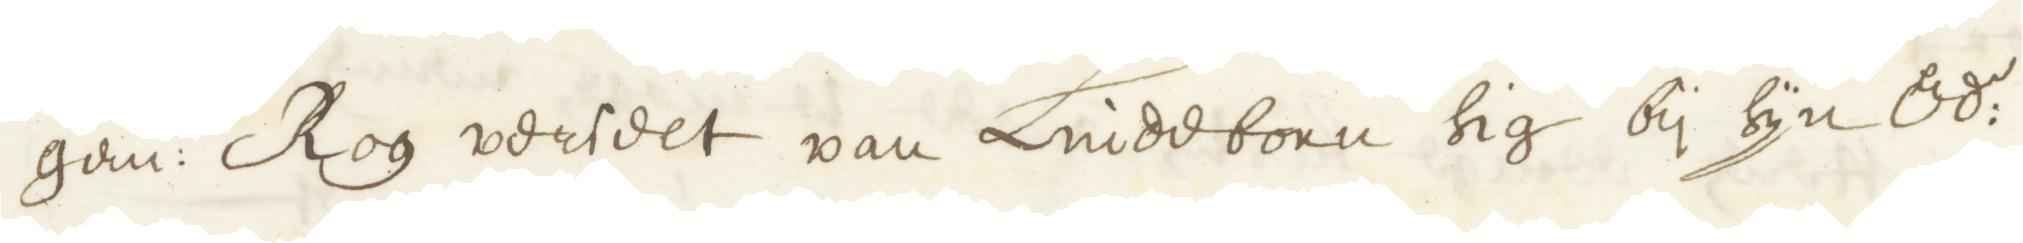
gem̄: Rog verselt van Lindeborn sig bij sijn Ed:e
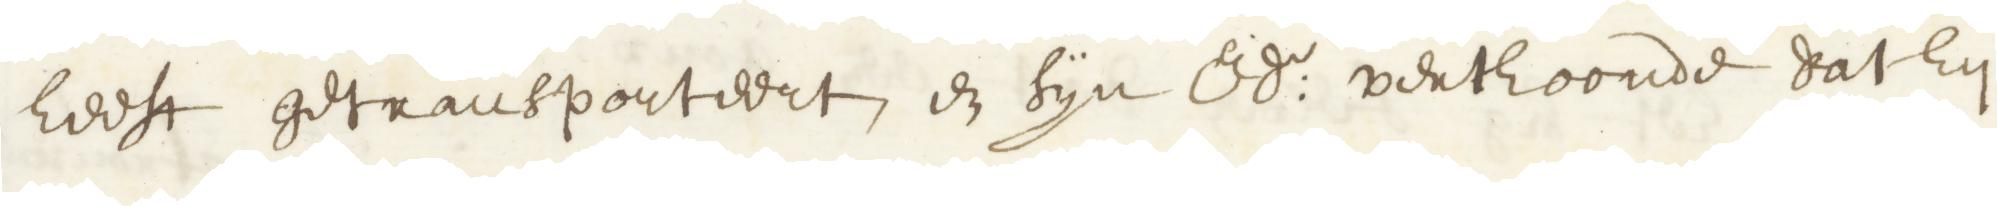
heeft getransporteert, en sijn Ed:e verthoonde dat hij
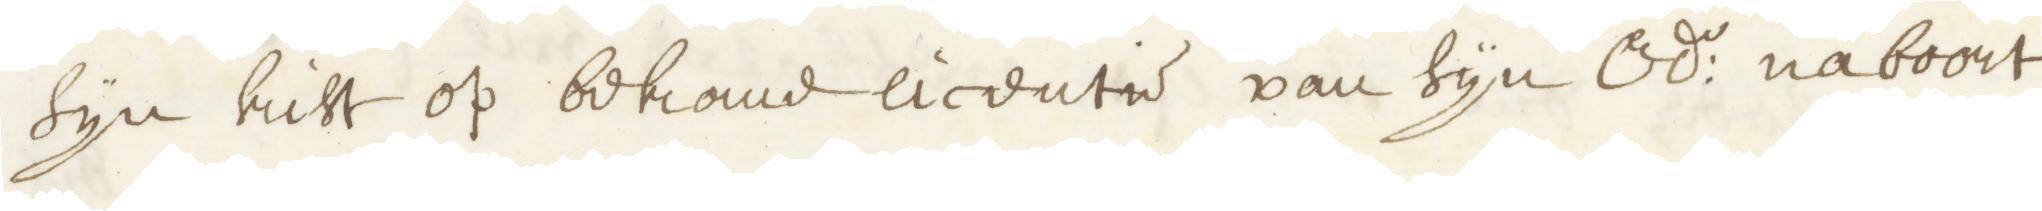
sijn kist op bekome licentie van sijn Ed:s na boort
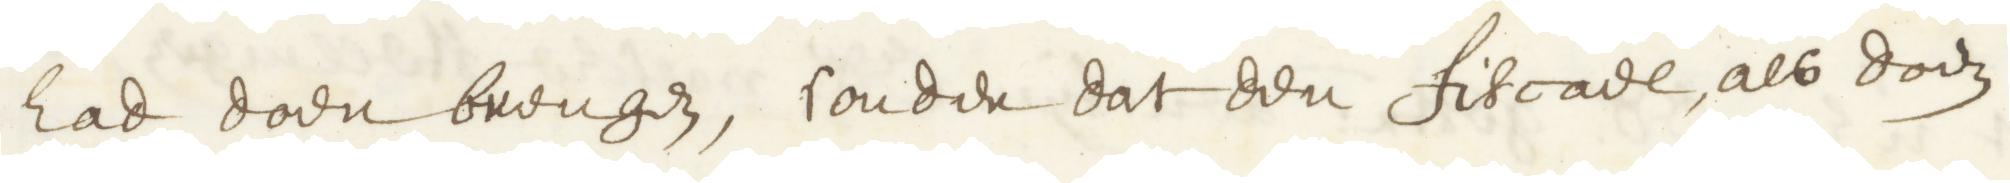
had doen brengen, sonder dat den fiscael, als doen
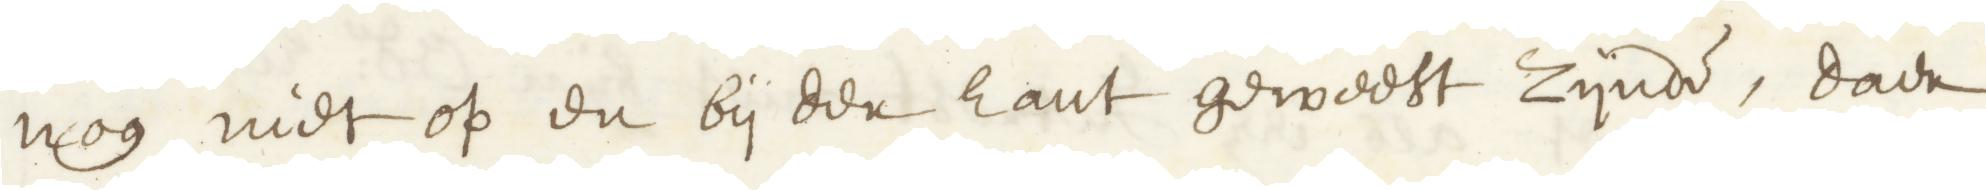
nog niet op en bij der hant geweest zijnde, daer
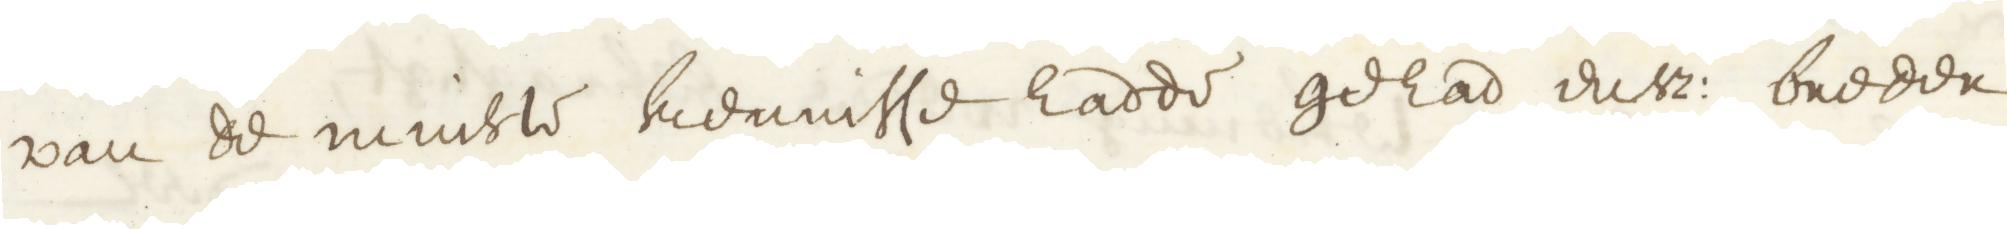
van de minste kennisse hadde gehad ensz: breder
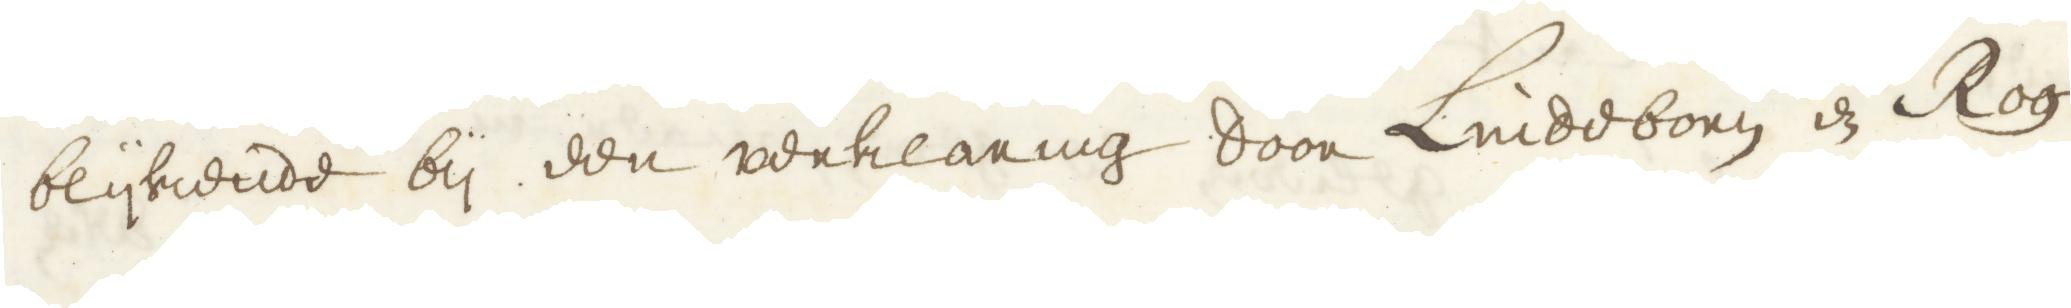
blijkende bij een verklaring door Lindeborn en Rog
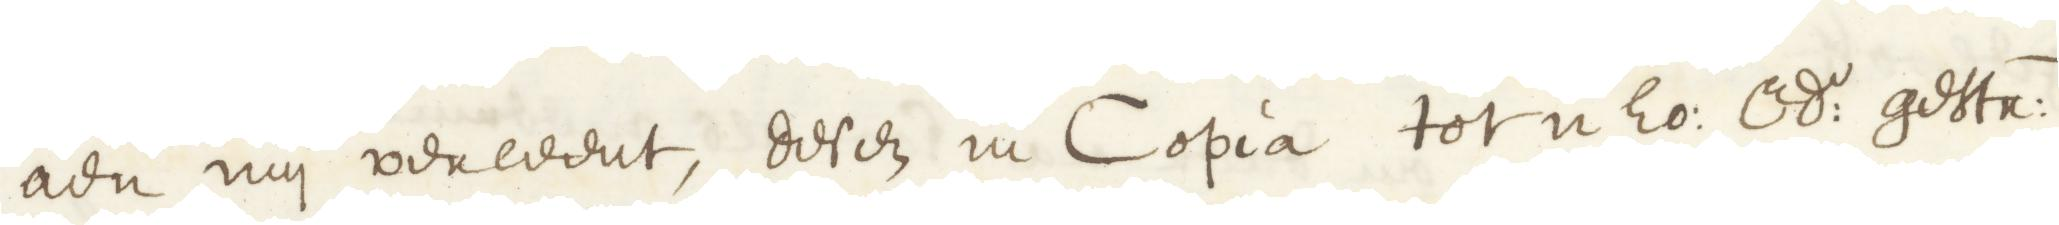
aen mij verleent, desen in Copia tot u ho: Ed:e gestr:
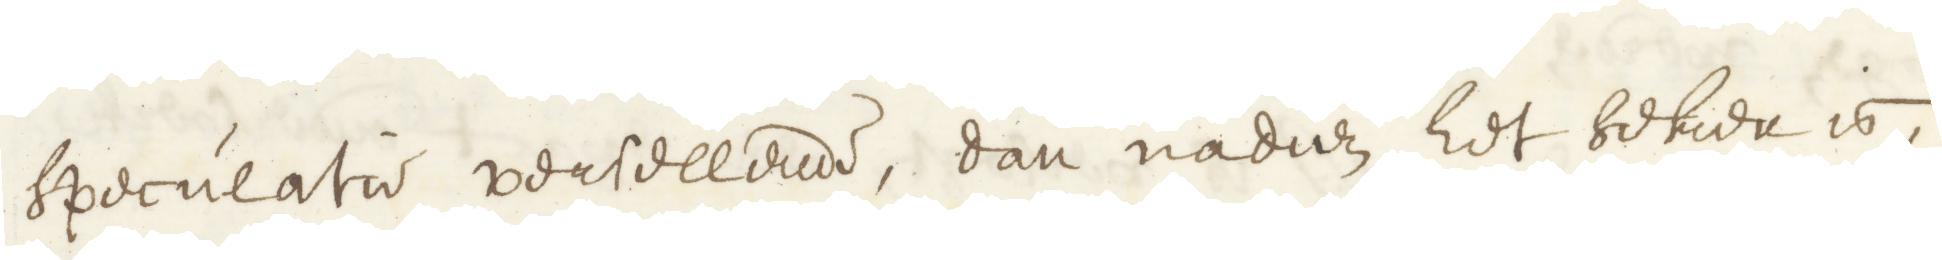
speculatie versellende, dan nadien het seker is,
